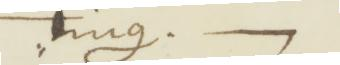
„ting. —
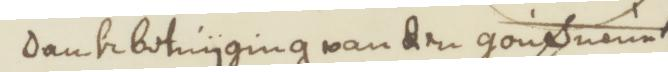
dank betuijging van den gouverneur
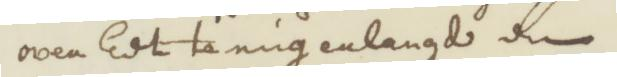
over het terugerlangde en
